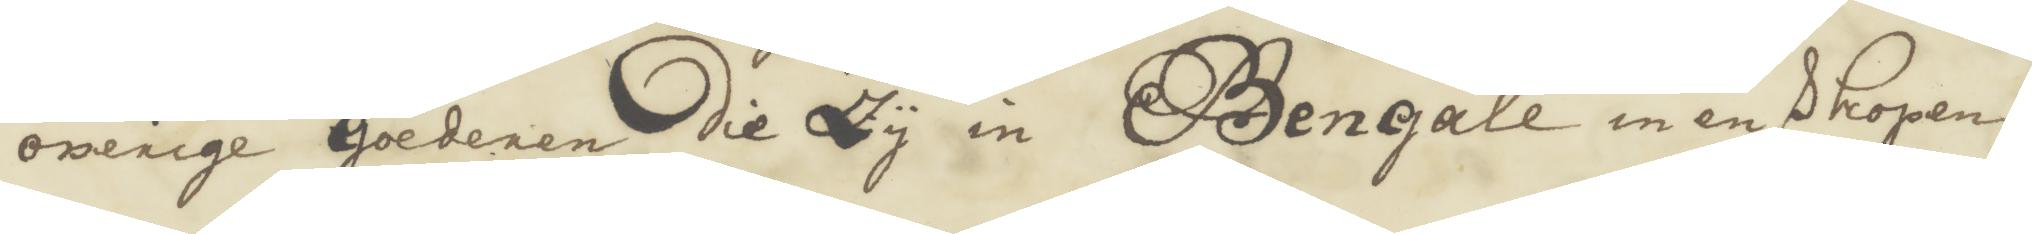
overige goederen die zij in Bengale in en verkopen
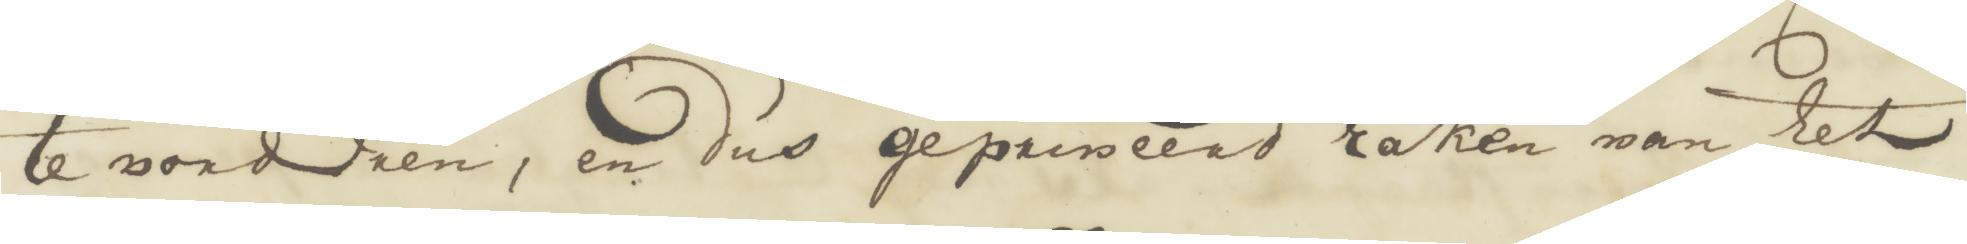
te vorderen, en dus gepriveerd raken van het
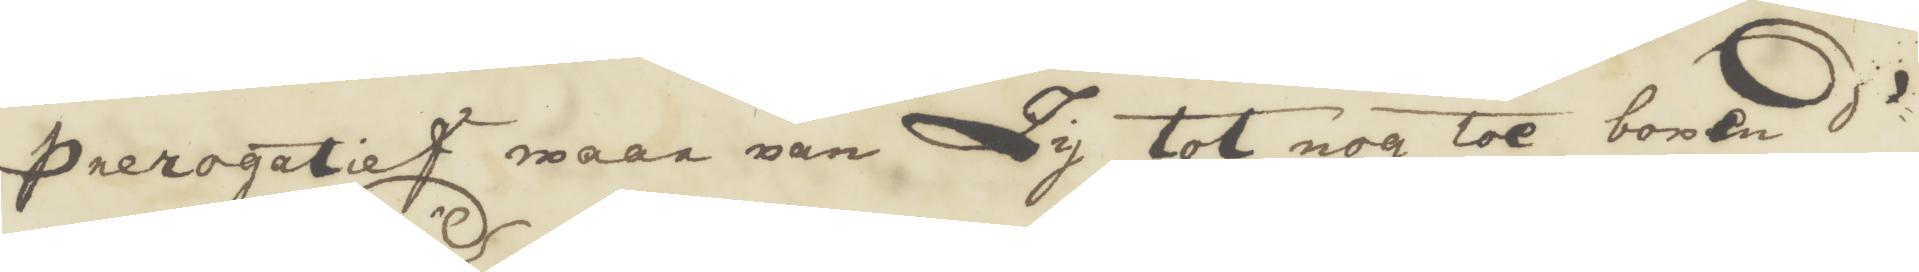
prerogatief waar van zij tot nog toe boven d'
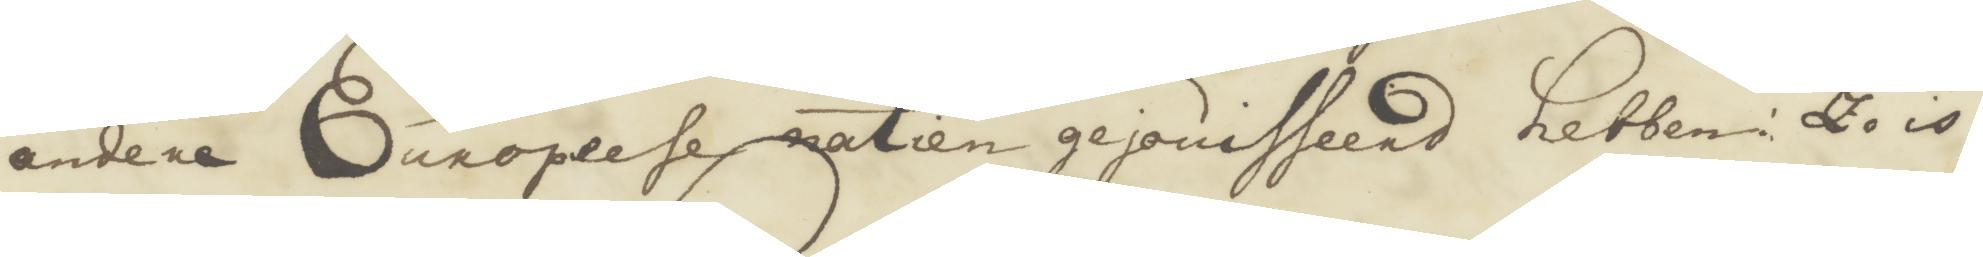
andere Europeese natien gejouisseerd hebben: zo is
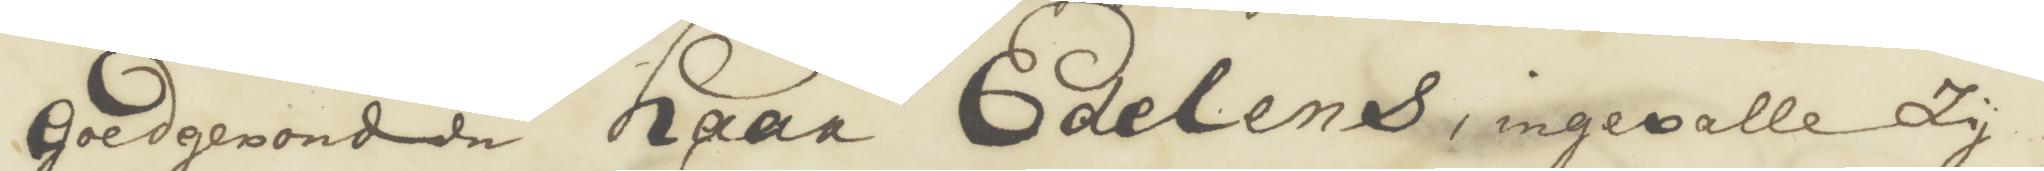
goedgevonden haar Edelens, ingevalle zij
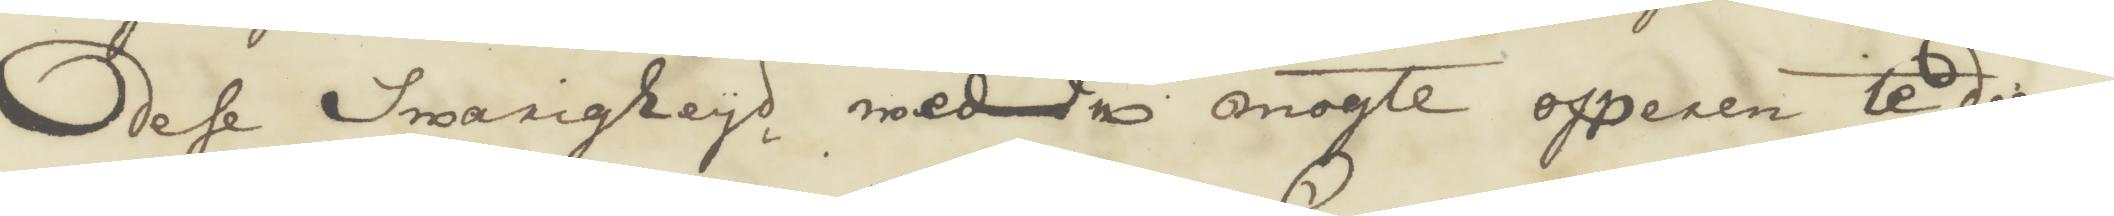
dese swarigheijd weder mogte opperen te doen
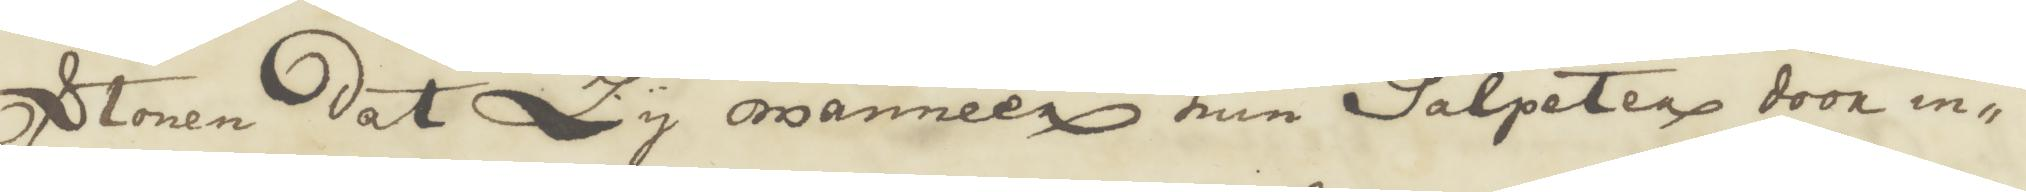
vertonen dat zij wanneer hun salpeter door in„
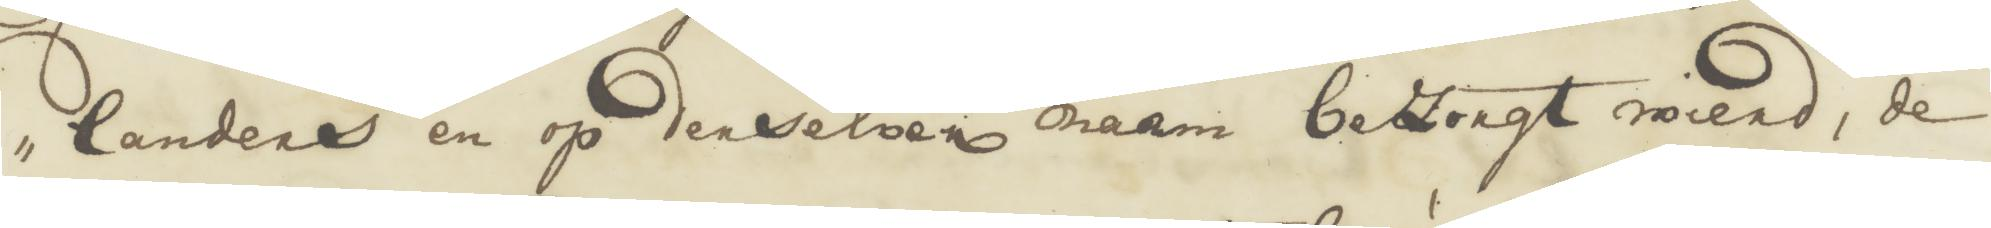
„landers en op derselver naam bezorgt wierd, de
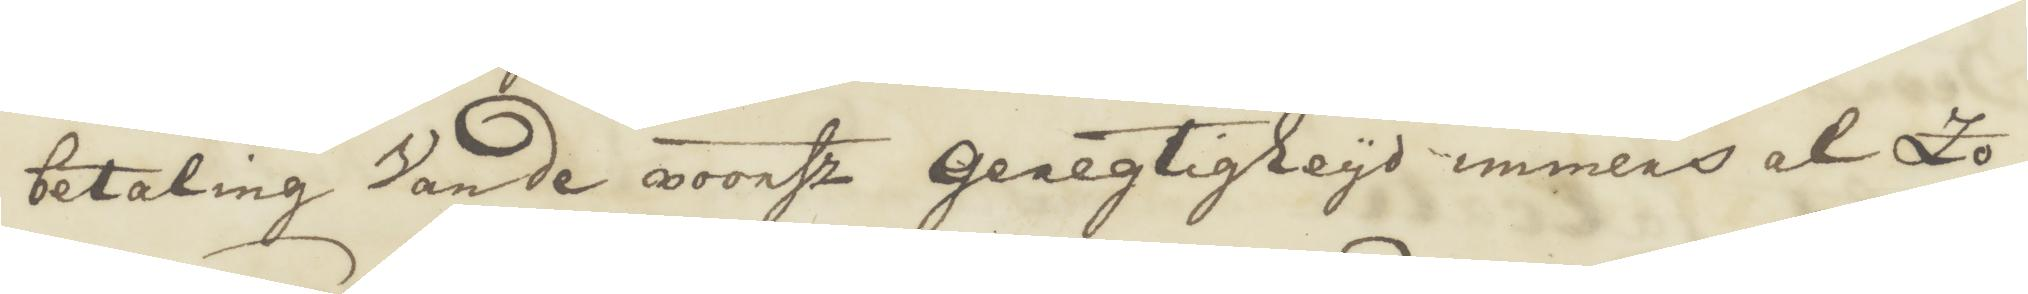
betaling van de voorsz geregtigheijd immers al zo
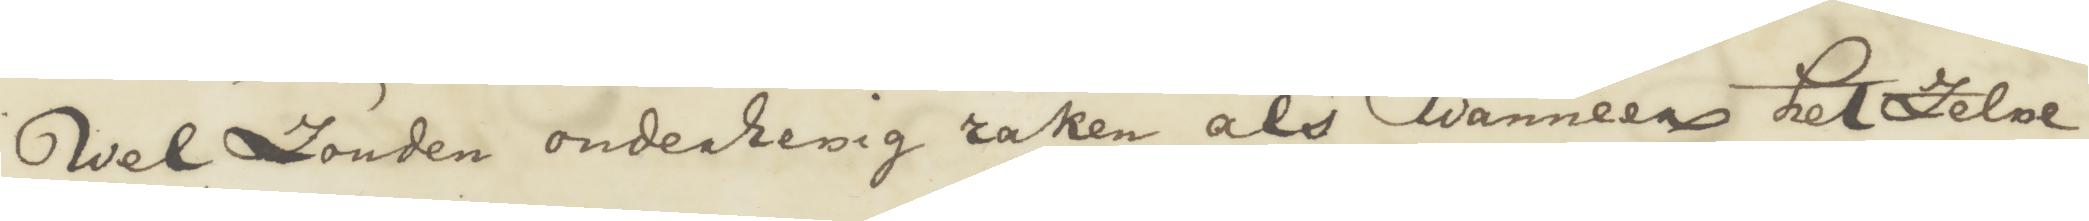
wel zouden onderhevig raken als wanneer het zelve
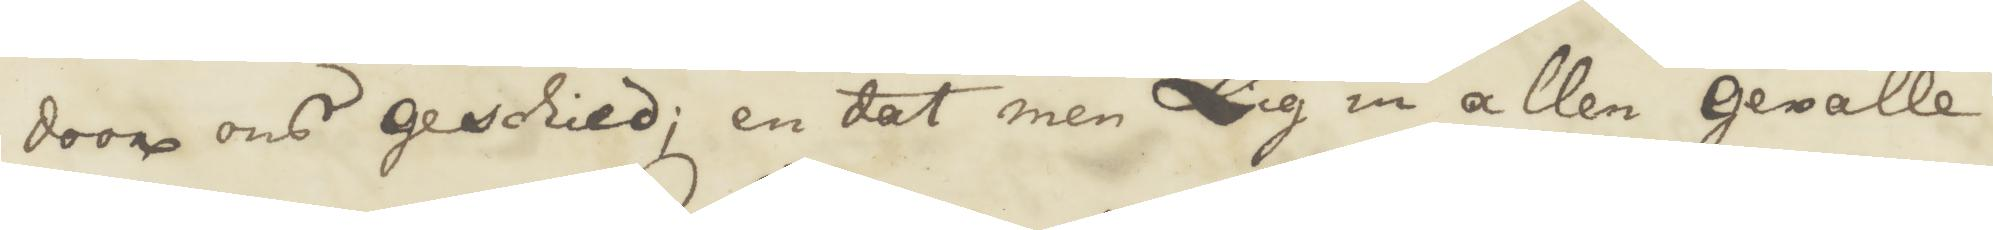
door ons geschied; en dat men zig in allen gevalle
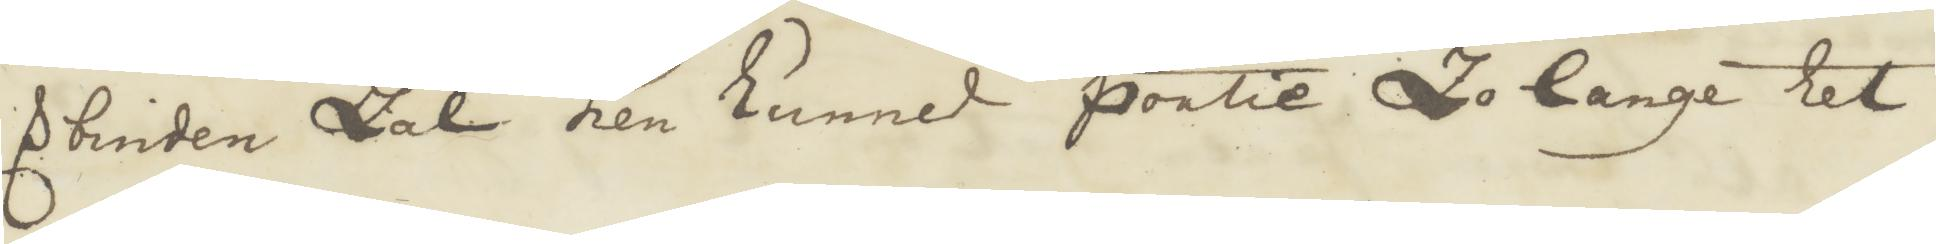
verbinden zal hen hunne portie zo lange het
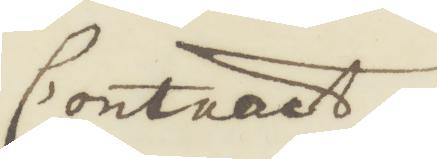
Contract
